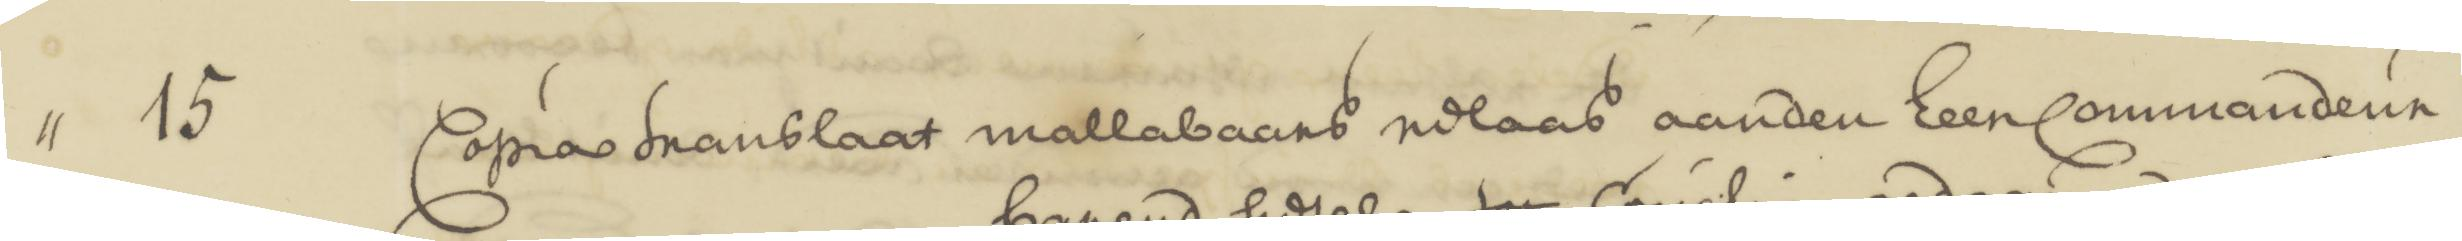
„ 15 Copia translaat mallabaars relaas aan den heer Commandeur
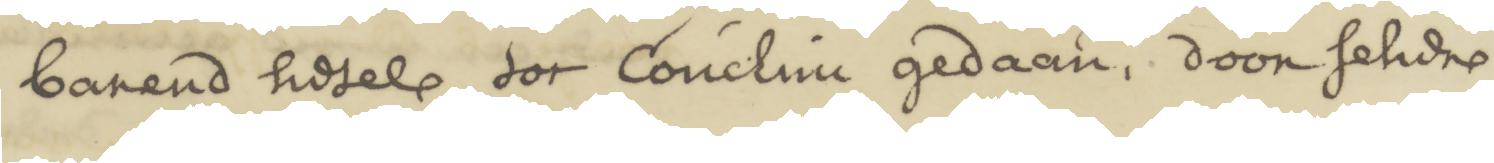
barend ketel tot Couchim gedaan, door seker
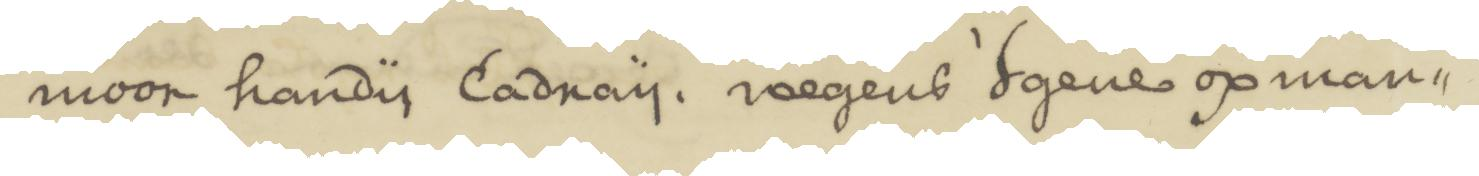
moor kandij Cadraij, wegens 't gene op man„
